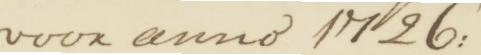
voor anno 1726:
